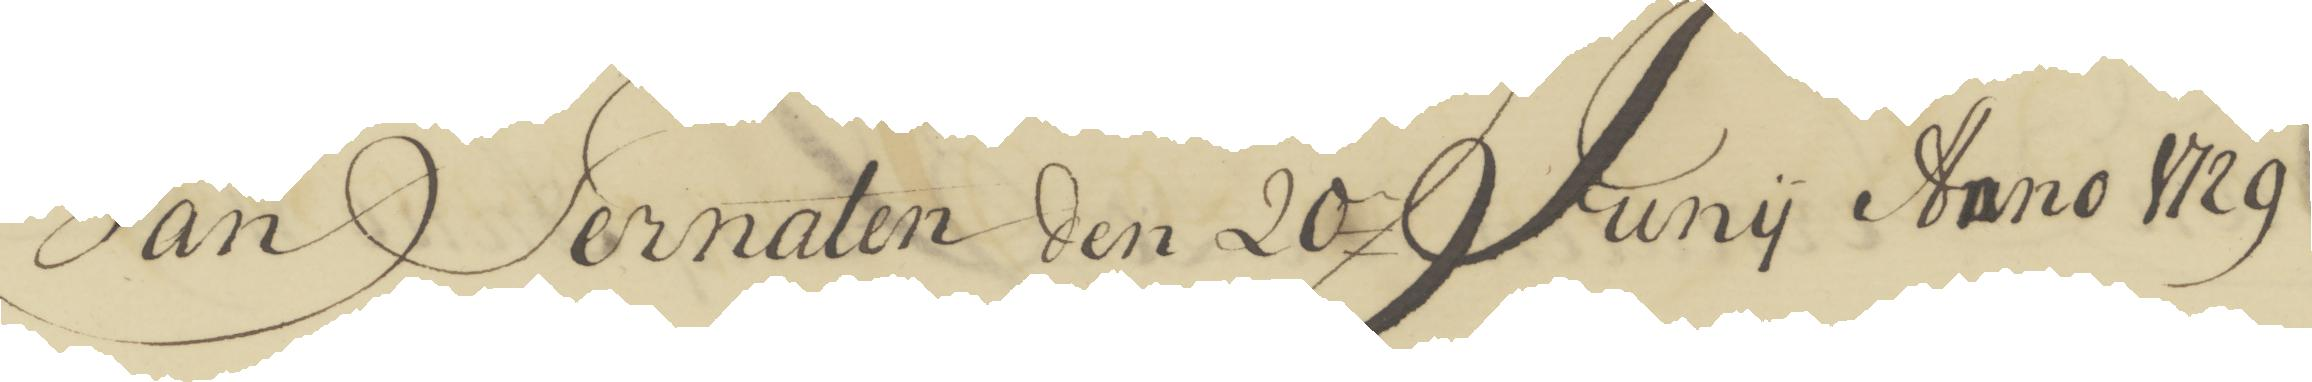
Van Ternaten den 20 Iunij Anno 1729
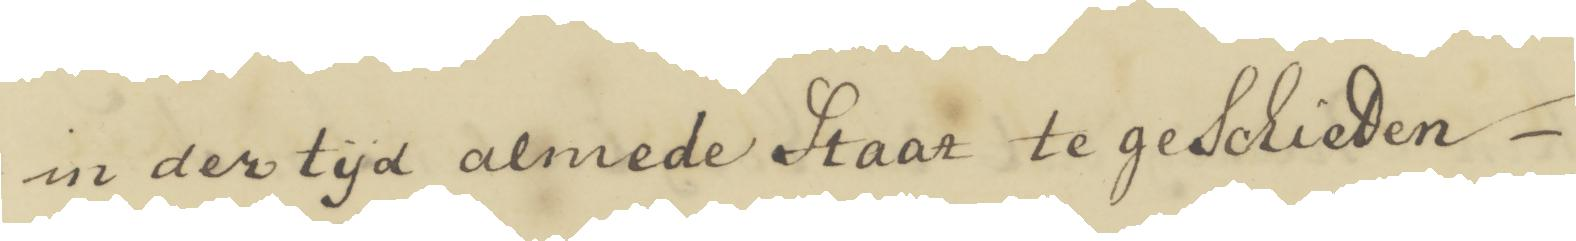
in der tijd almede Staat te geschieden —
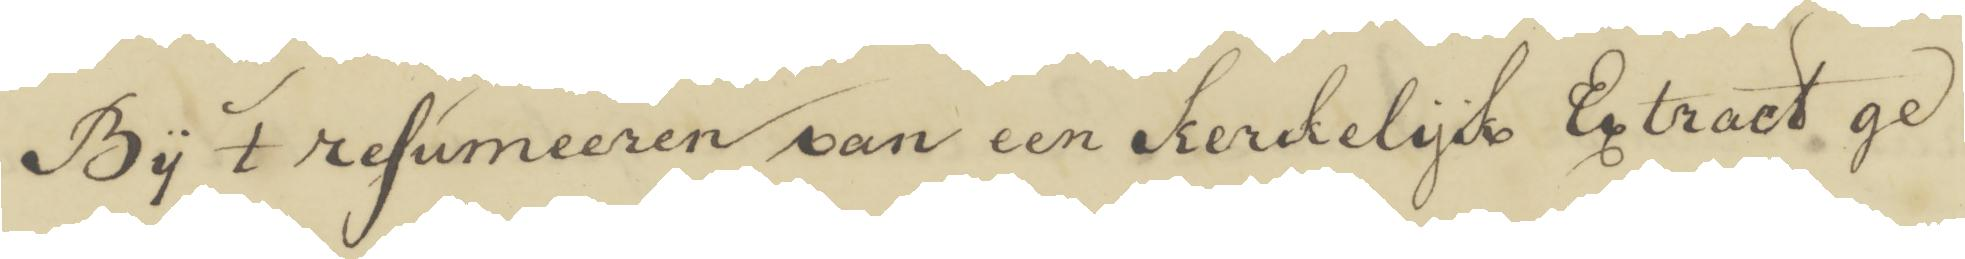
Bij ’t resumeeren van een kerkelijk Extract ge
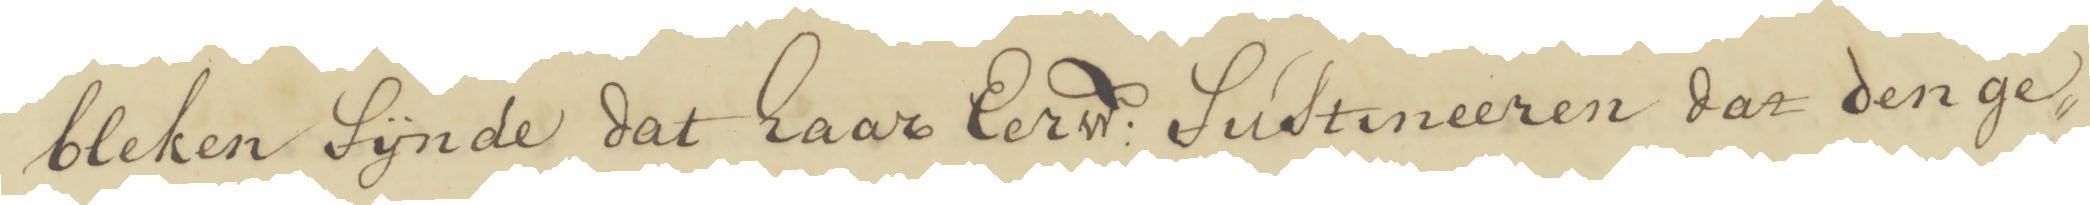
bleken Sijnde dat haar Eerw: Sustineeren dat den ge„
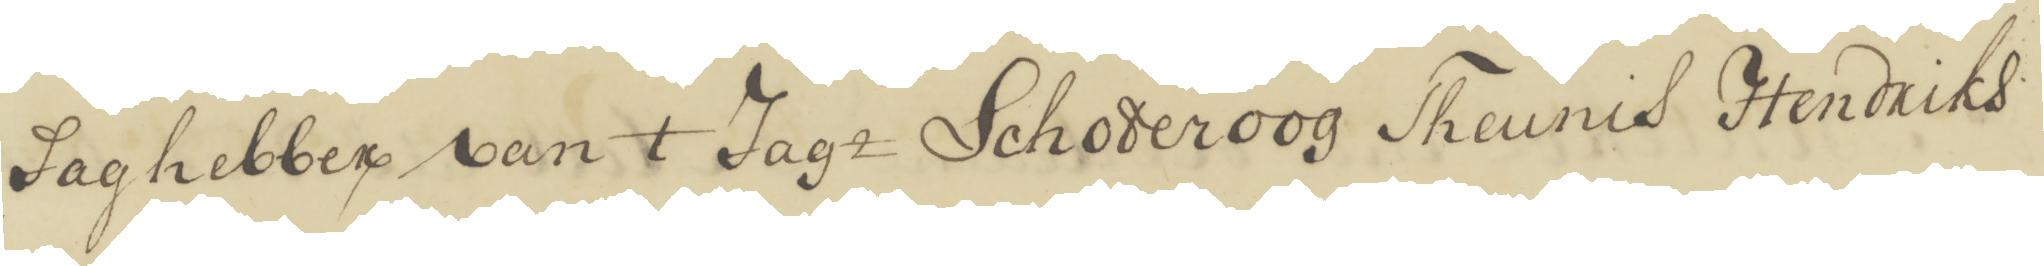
Saghebber van t Iagt Schoteroog Theunis Hendriks
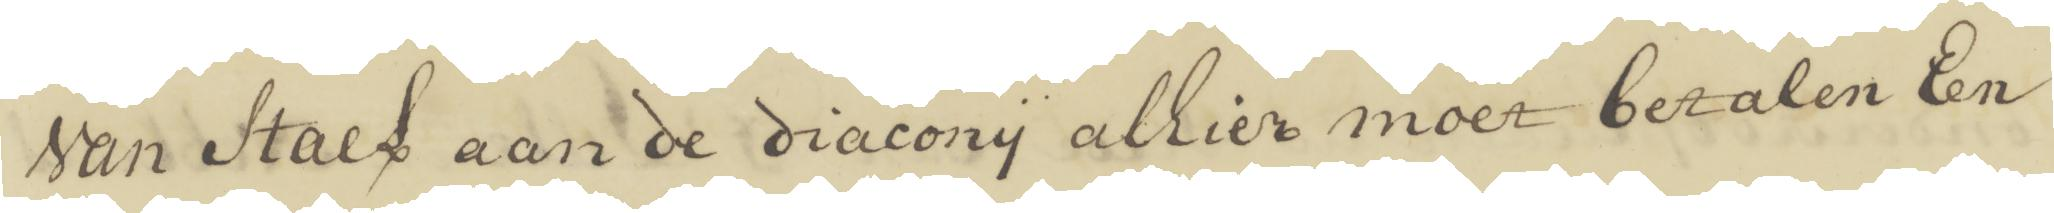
van Stael aan de diaconij alhier moet betalen Een
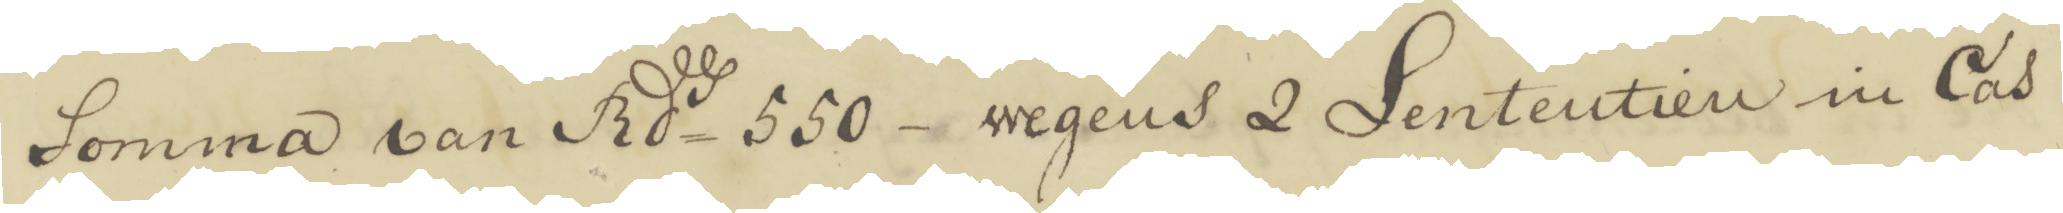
Somma van Rd=s 550 - wegens 2 Sententien in Cas
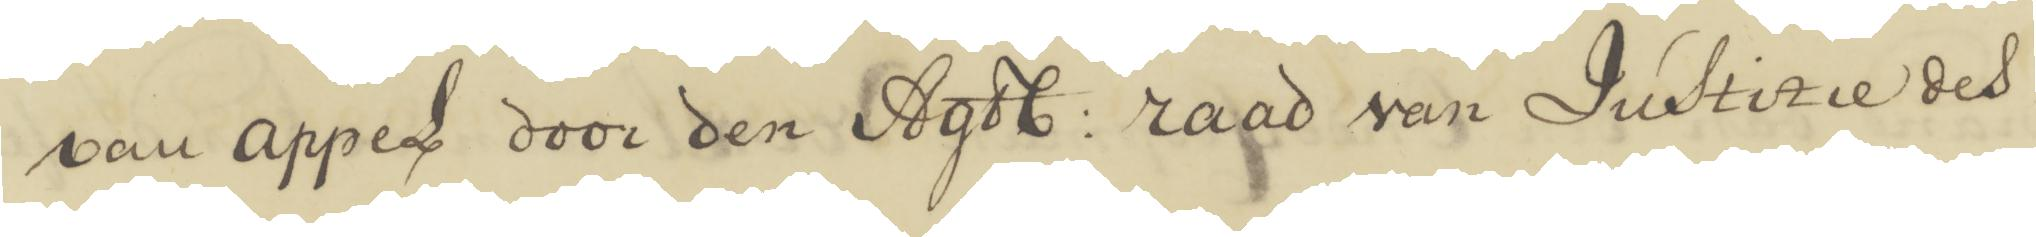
van appel door den Agtb: raad van Iustitie des
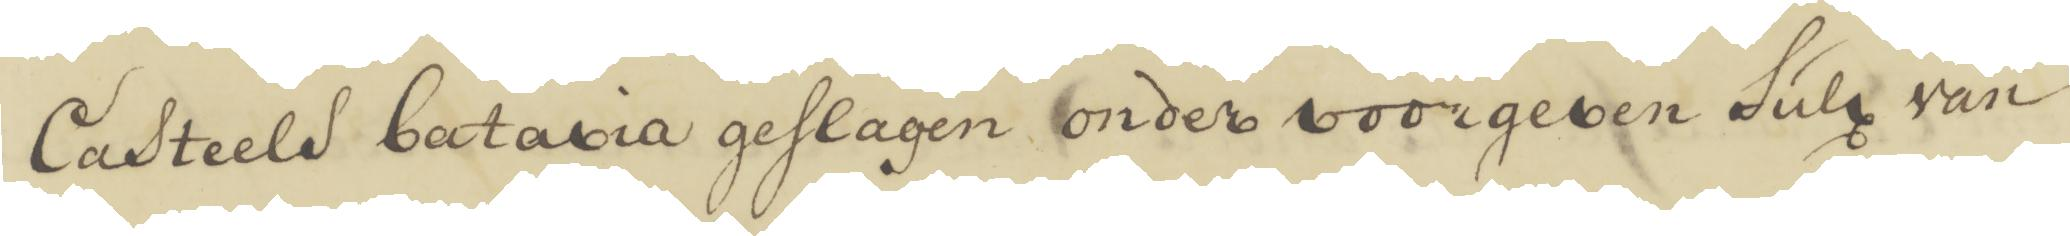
Casteels batavia geslagen onder voorgeven Sulx van
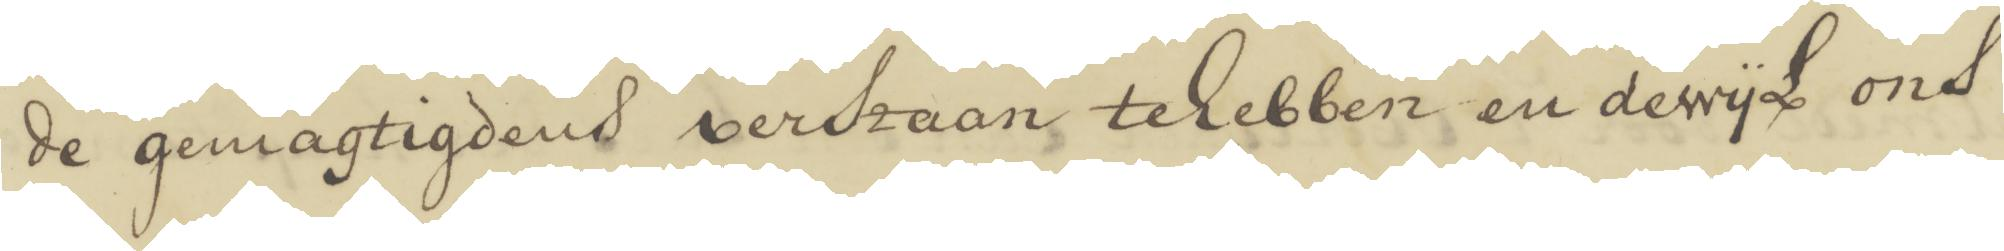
de gemagtigdens verstaan te hebben en dewijl ons
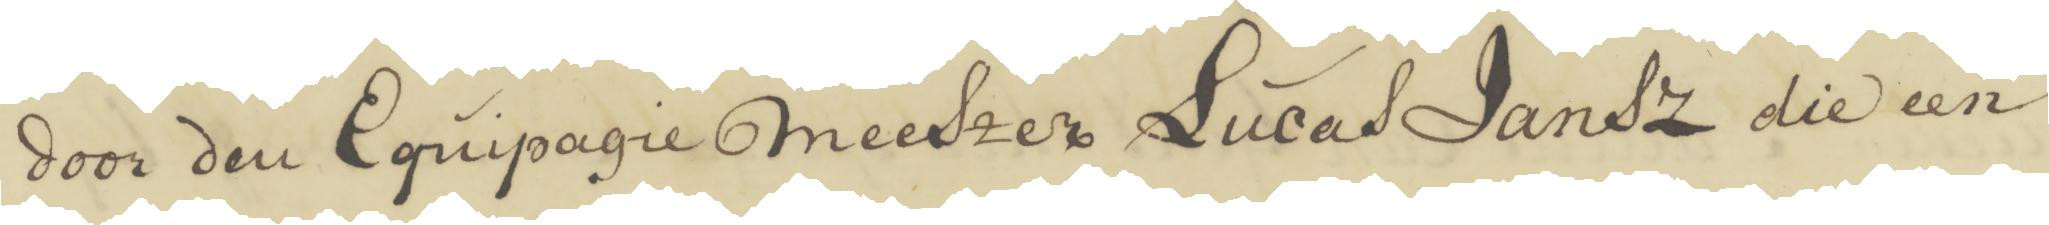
door den Equipagie meester Lucas Iansz die een
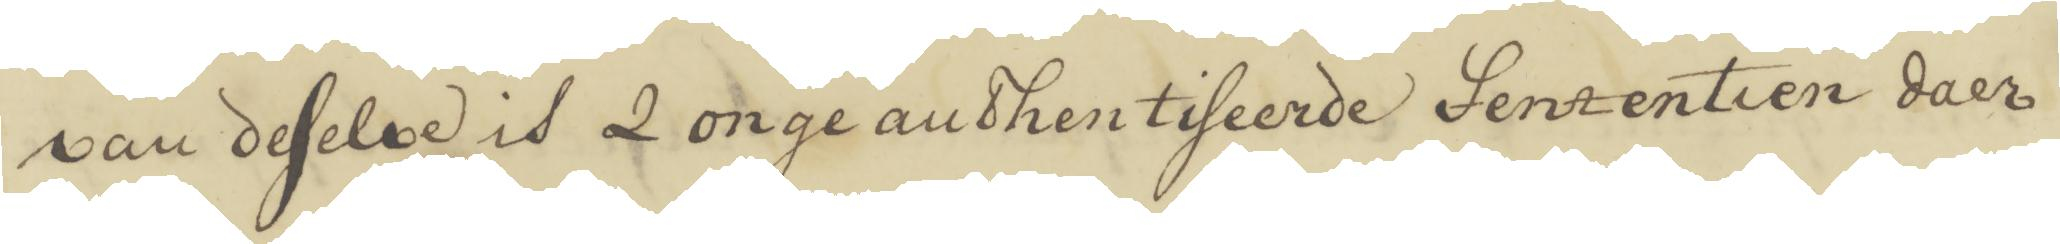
van deselve is 2 ongeauthentiseerde Sententien daer
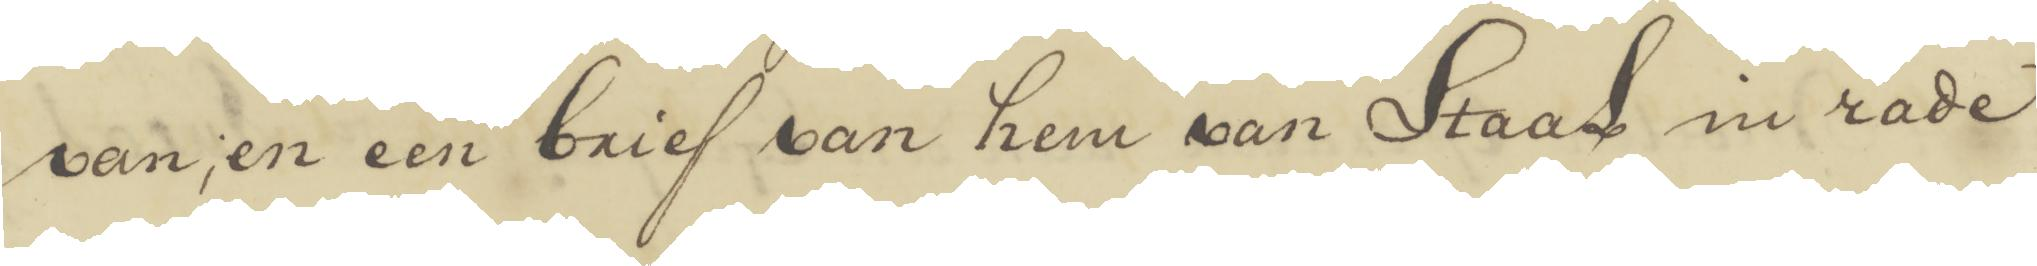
van; en een brief van hem van Staal in rade
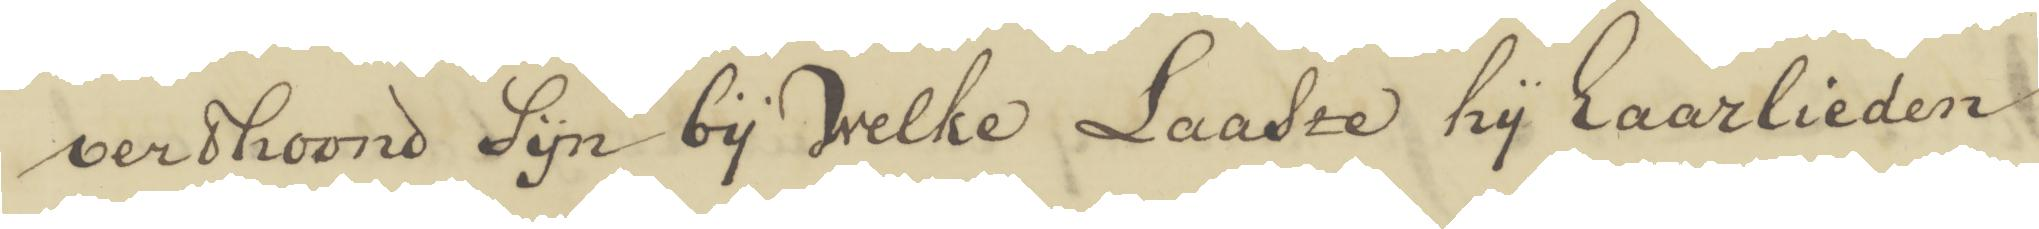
verthoond Sijn bij welke Laaste hij haarlieden
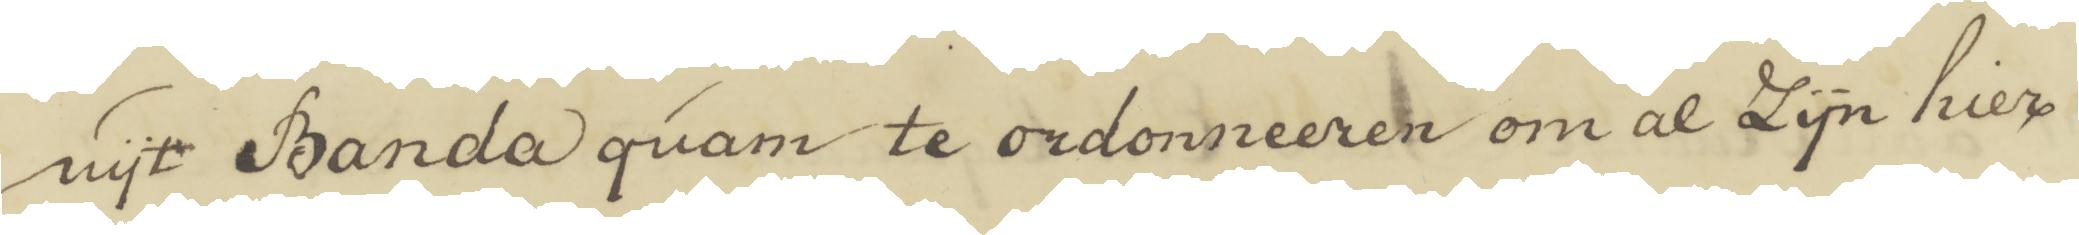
uijt Banda quam te ordonneeren om al Zijn hier
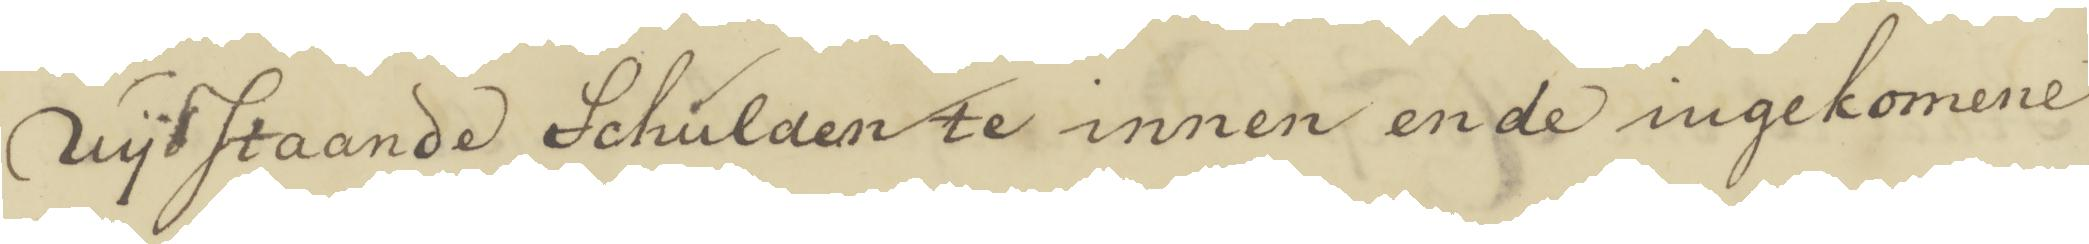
uijtstaande Schulden te innen ende ingekomene
